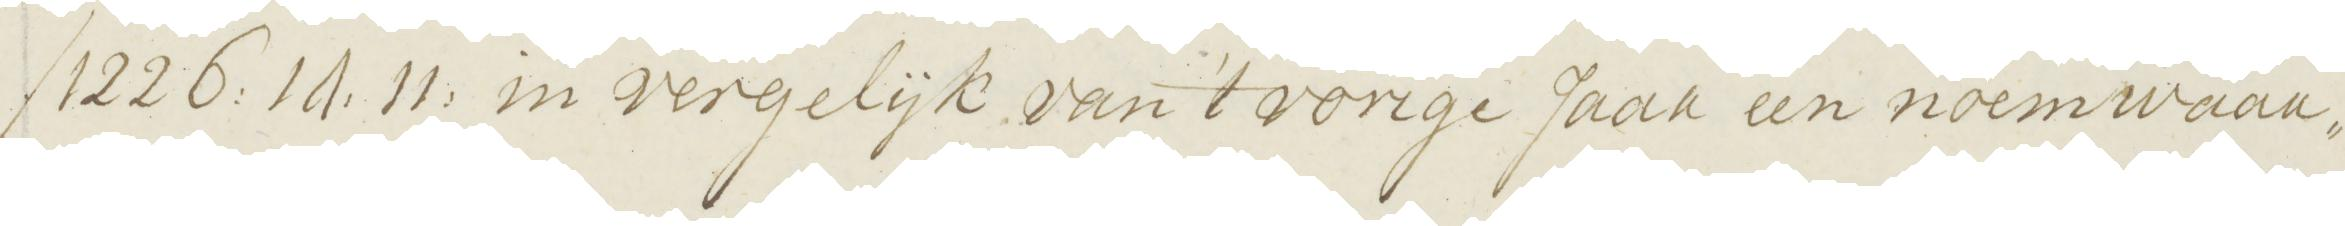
ƒ1226: 14: 11: in vergelijk van ’t vorige Jaar een noemwaar
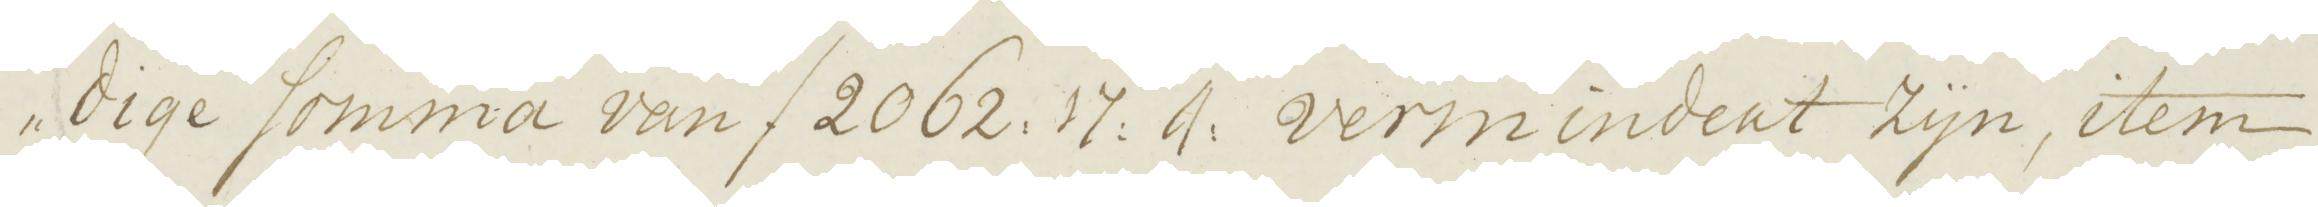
„dige somma van ƒ2062: 17: 4: vermindert zijn, item
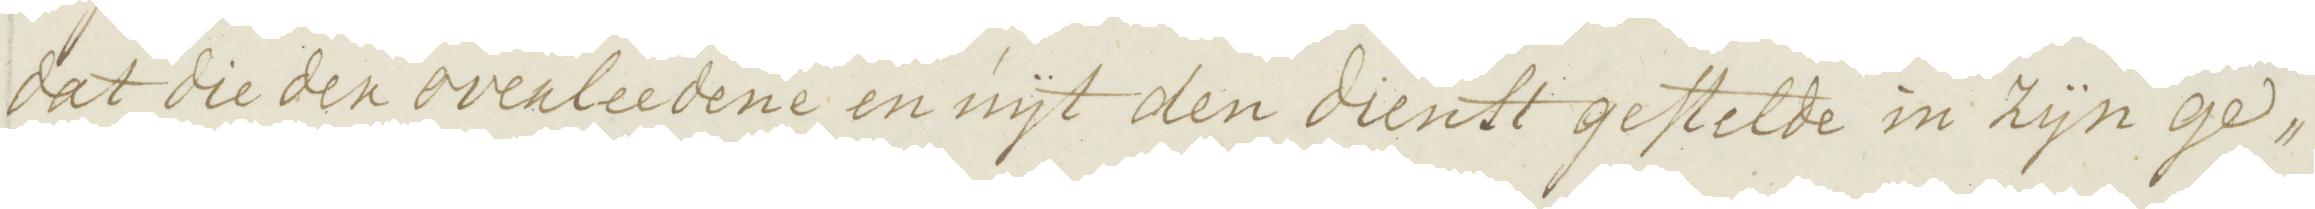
dat die der overleedene en uijt den dienst gestelde in zijn ge„
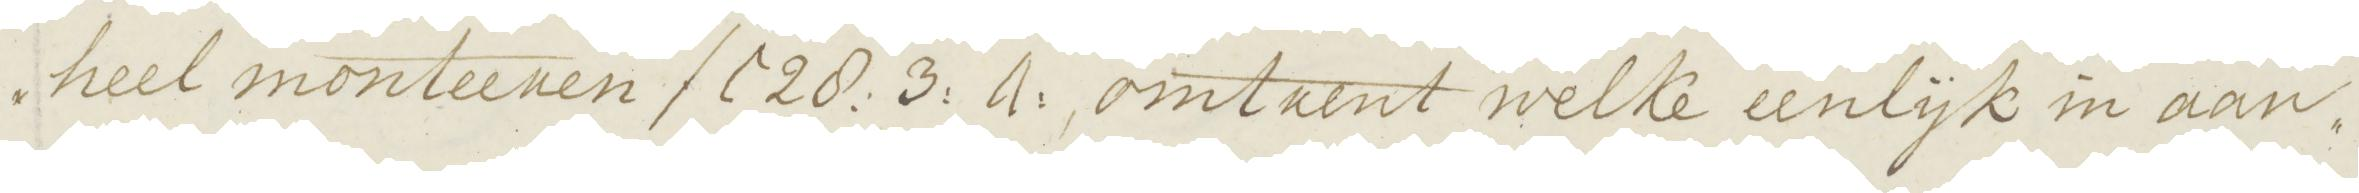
„heel monteeren ƒ528:3: 4:, omtrent welke eenlijk in aan„
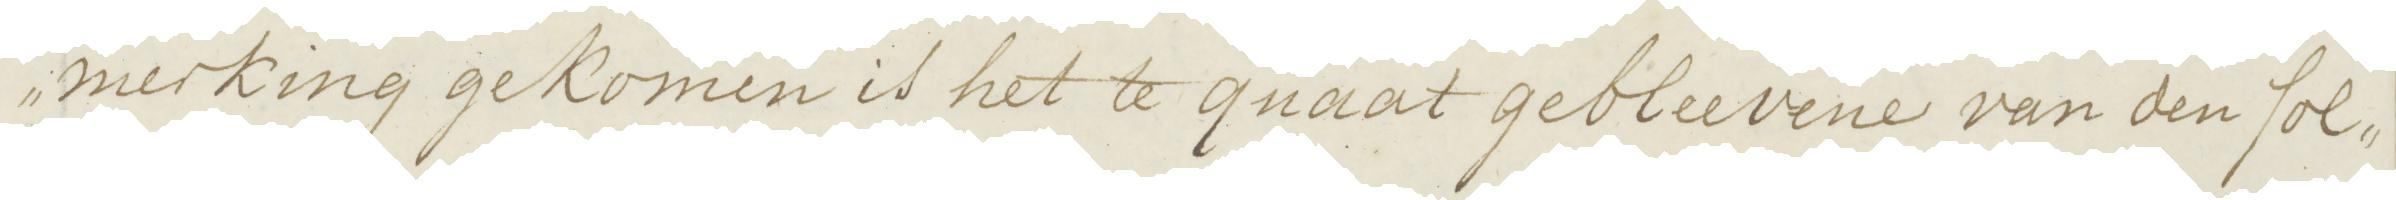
„merking gekomen is het te quaat gebleevene van den sol„
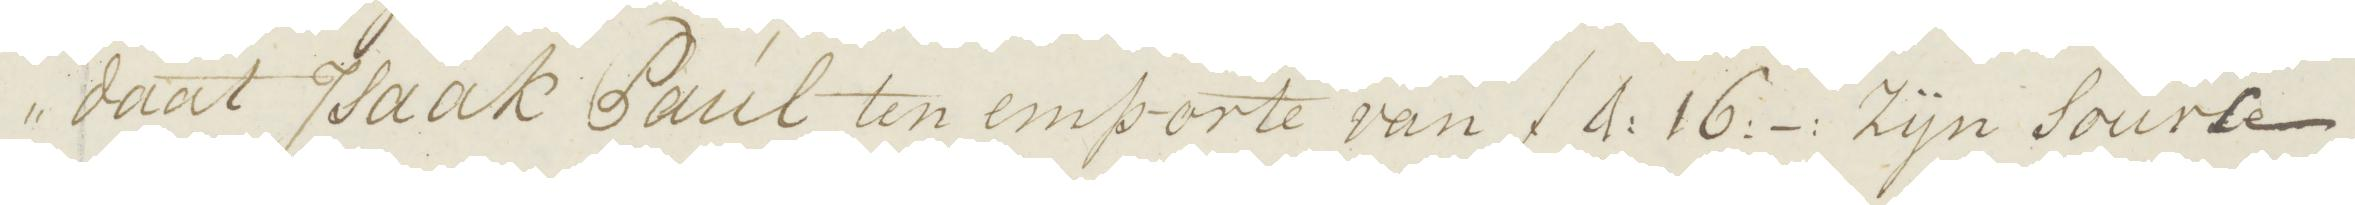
„daat Jsaak Paul ten emporte van ƒ 4: 16:-: zijn source
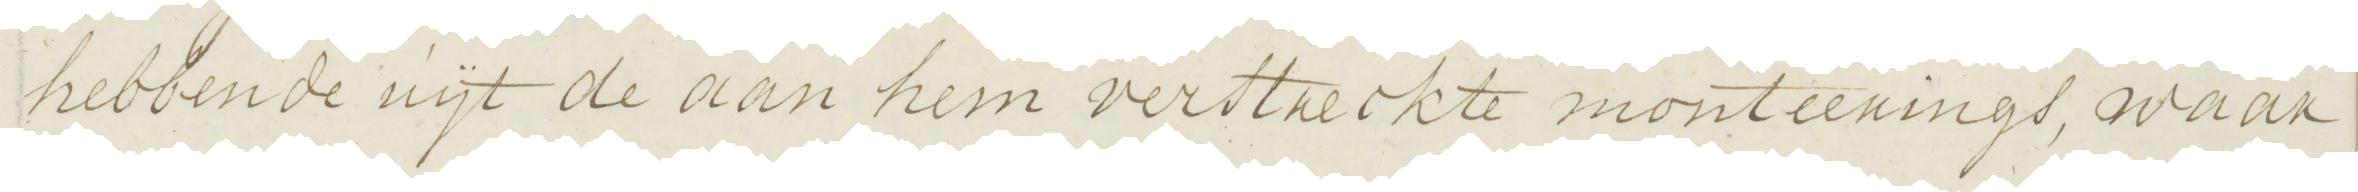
hebbende uijt de aan hem verstreckte monteerings, waar
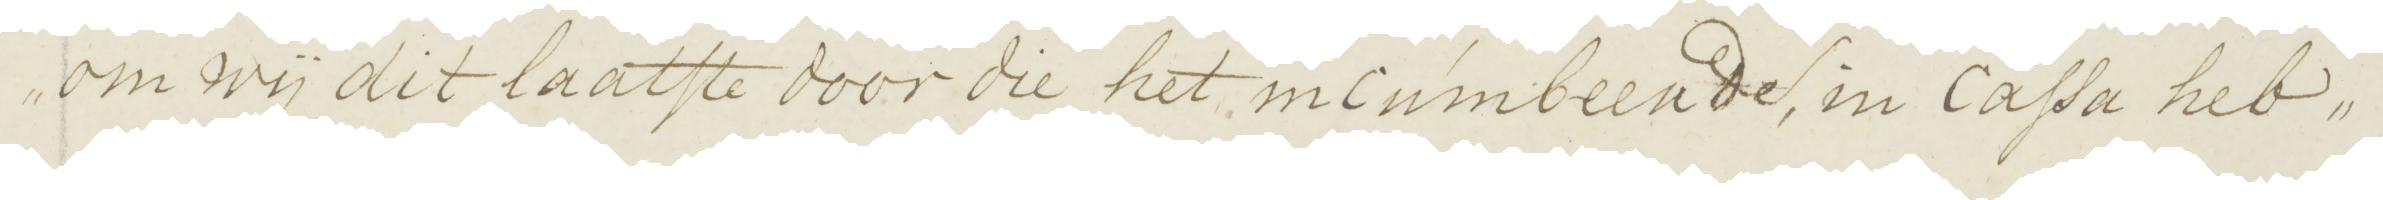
„om wij dit laatste door die het incumbeerde, in cassa heb„
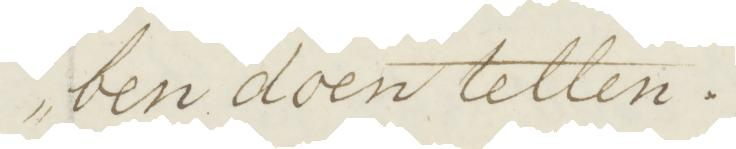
„ben doen tellen.
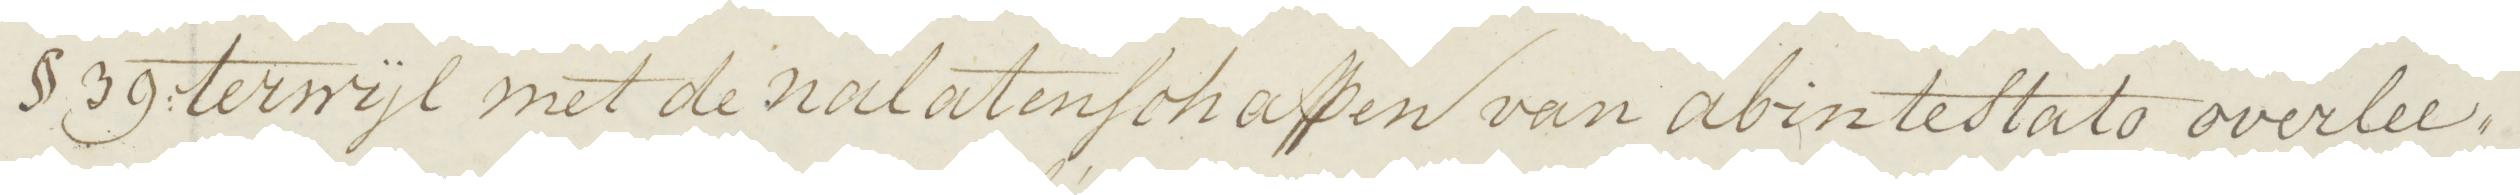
§ 39: terwijl met de nalatenschappen van abintestato overlee„
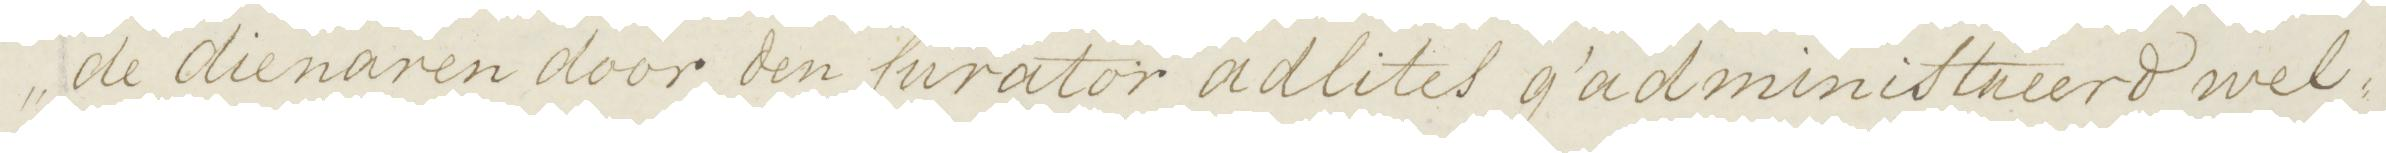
„de dienaren door den curator adlites g’administreerd wel„
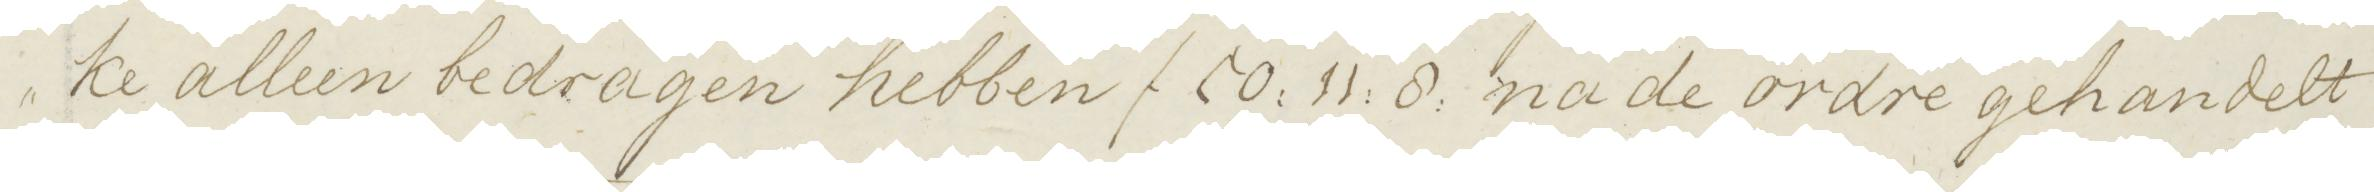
„ke alleen bedragen hebben ƒ 50: 11: 8: na de ordre gehandelt
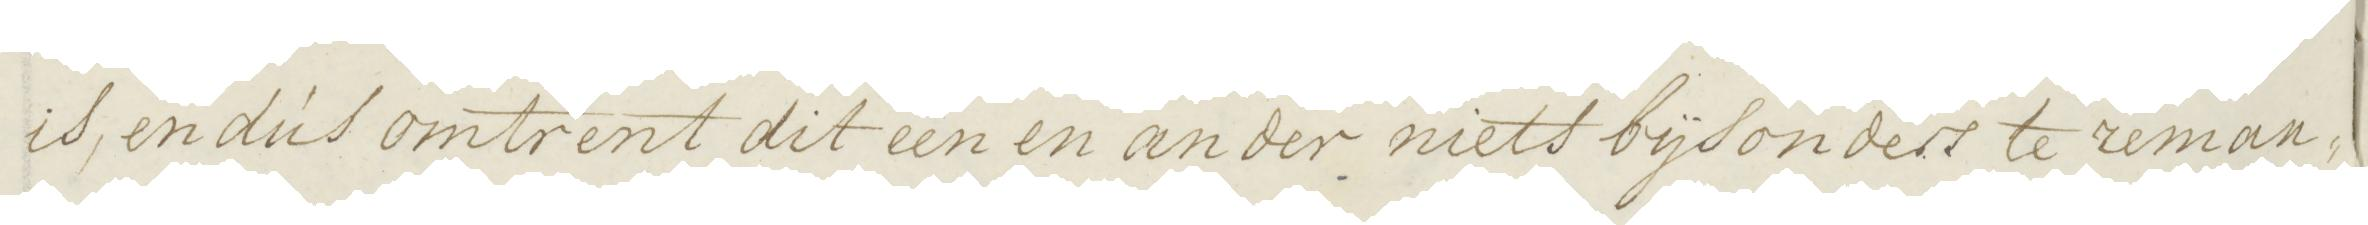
is, en dus omtrent dit een en ander niets bijsonders te remar„
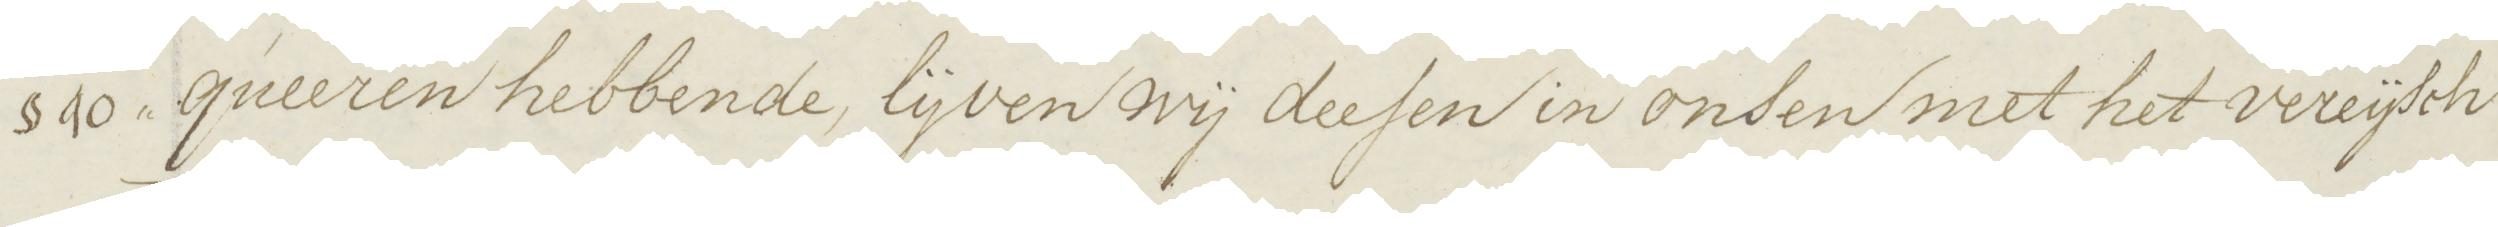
§ 40 „ queeren hebbende, lijven wij deesen in onsen met het vereijsch
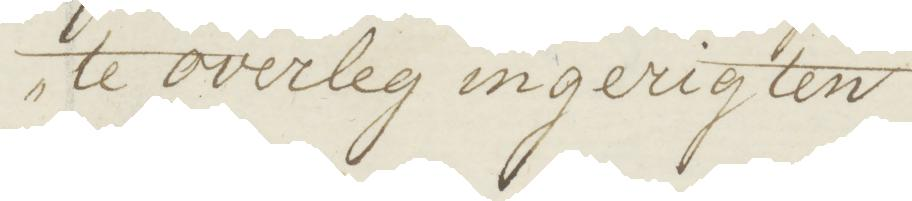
„te overleg ingerigten
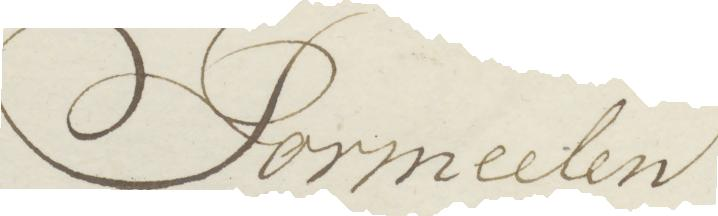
Formeelen
